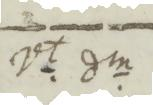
V-.t d-.m
